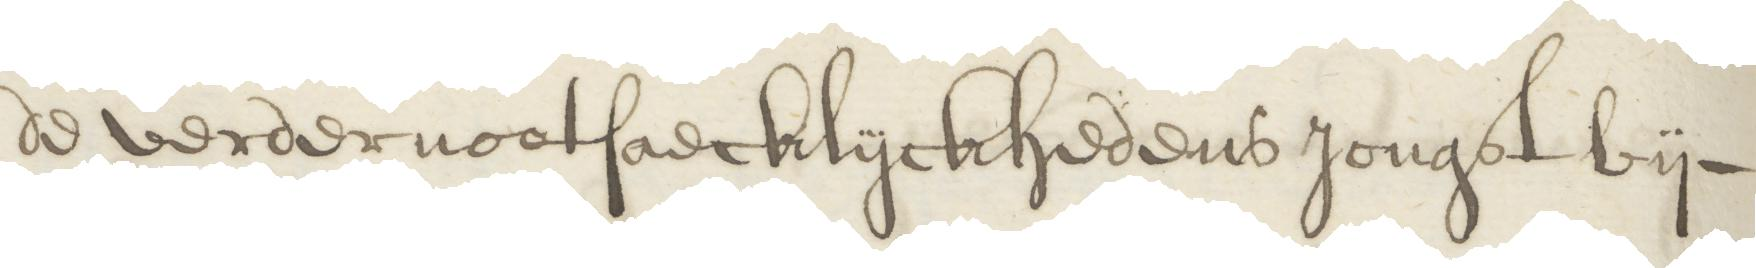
de verder nootsaecklijckhedens jongst bij–
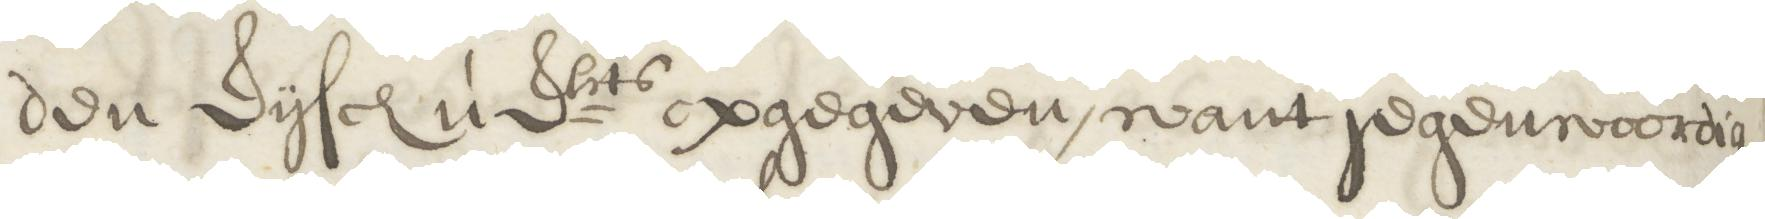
den Eijsch u E=hts opgegeven, want jegenwoordig
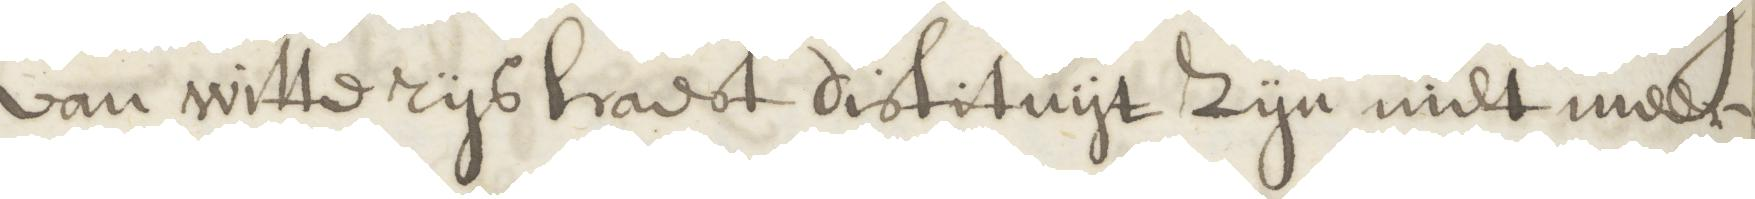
van witte rijs haest distituijt zijn niet meer
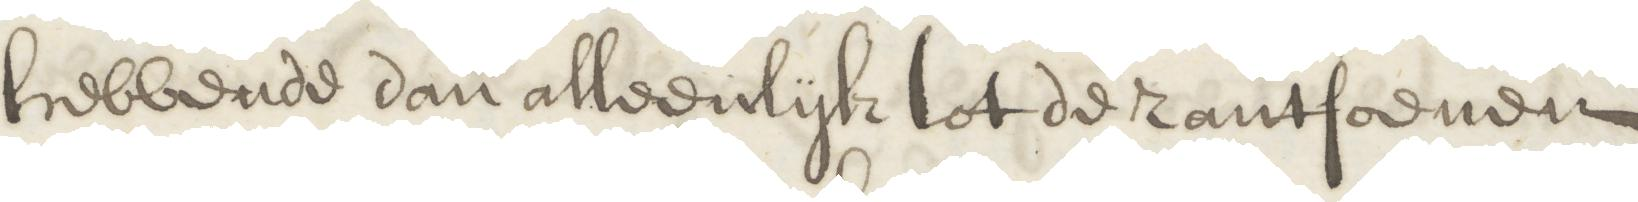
hebbende dan alleenlijk tot de rantsoenen
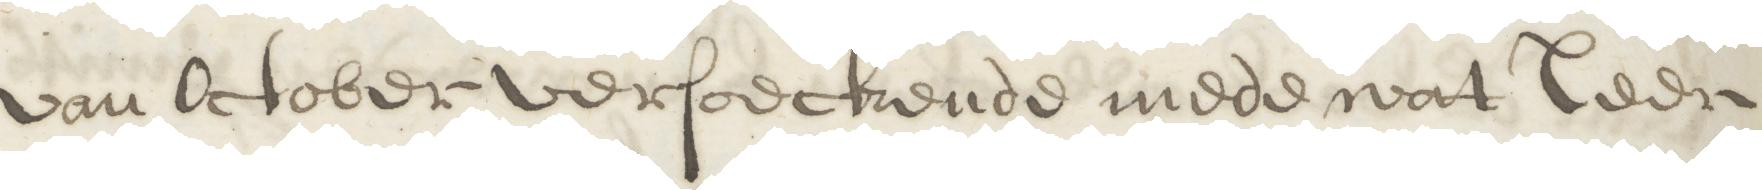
van October versoeckende mede wat Teer
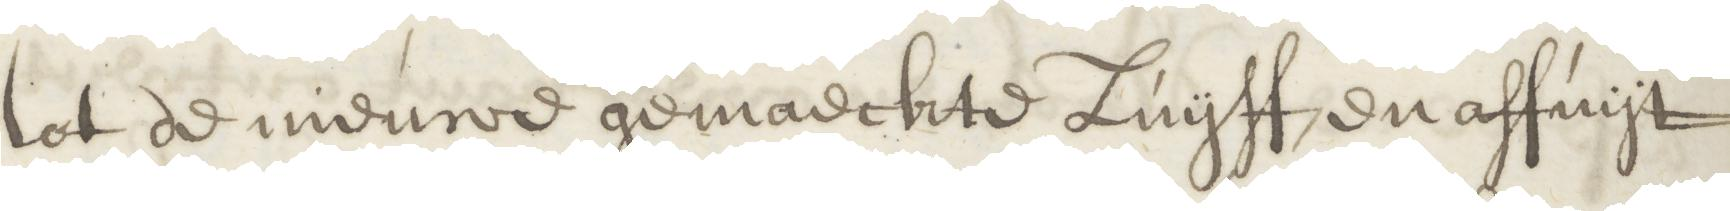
tot de nieuwe gemaeckte zuijff, en affuijt
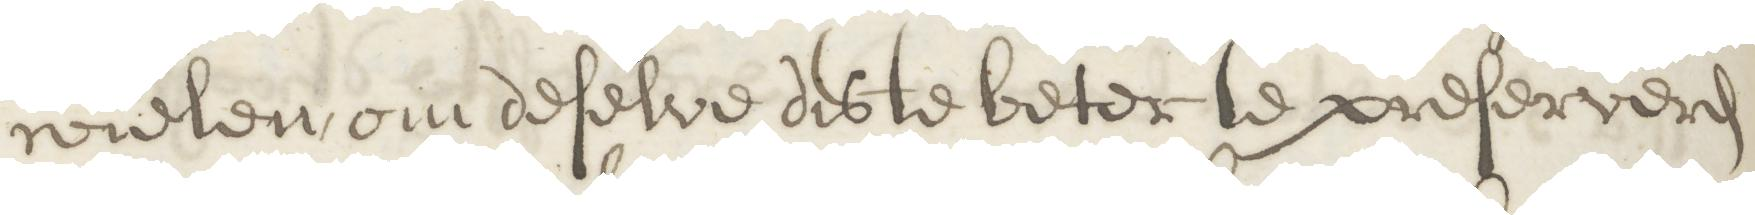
wielen, om deselve des te beter te preserveren
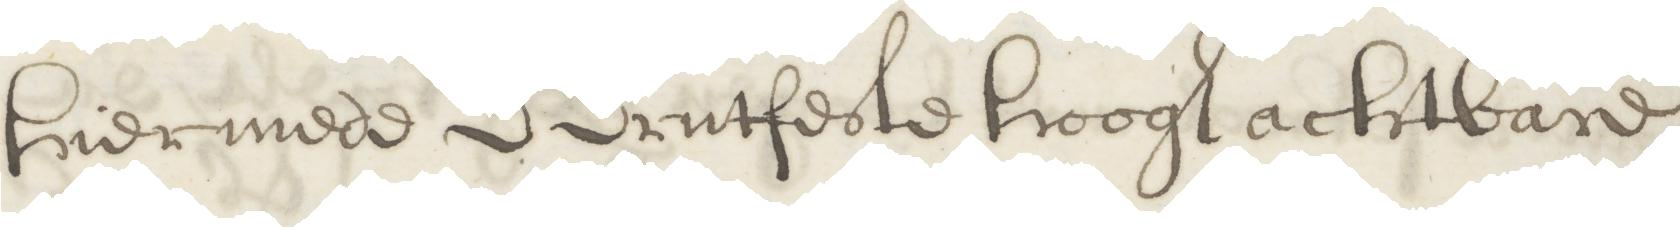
hiermede E Erntfeste hoogh achtbare
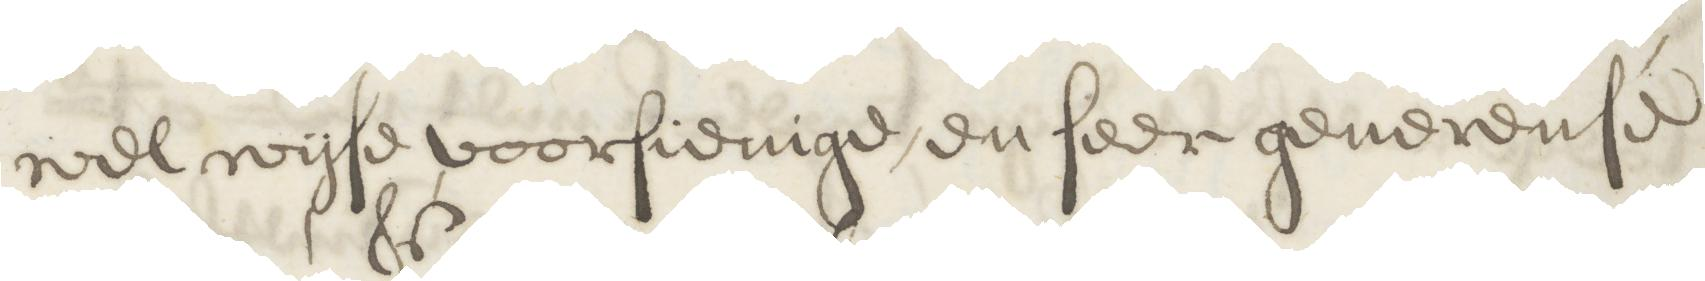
wel wijse, voorsienige, en seer genereuse
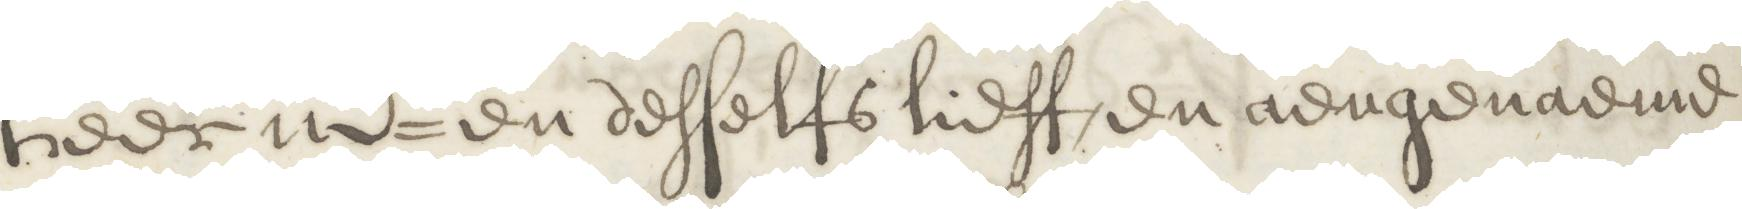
heer uE=s en desselfs lieff, en aengenaeme
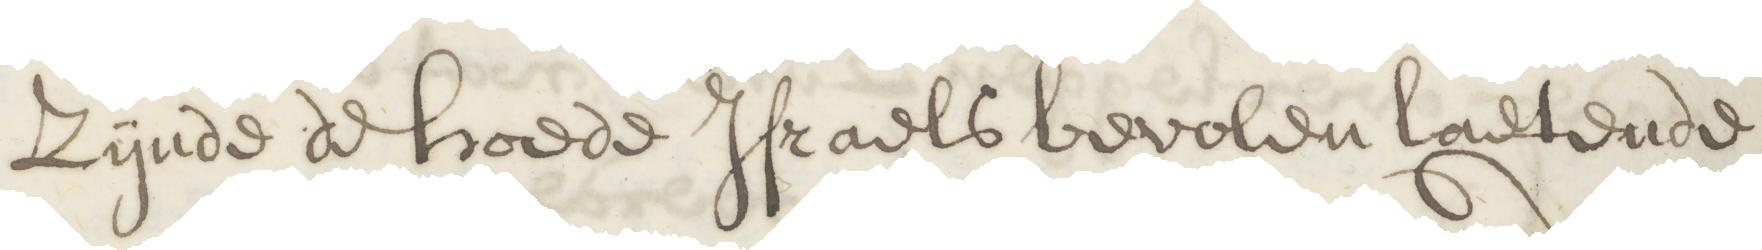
zijnde de hoede Israels bevolen laetende
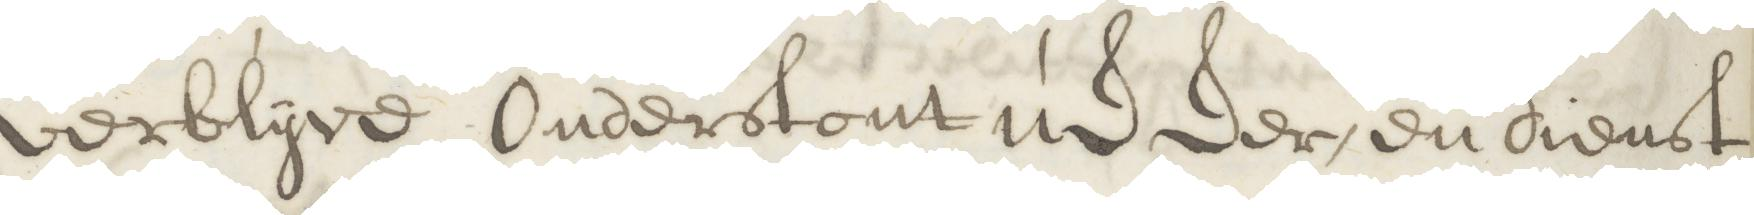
verblijve Onderstont uE Eer, en dienst
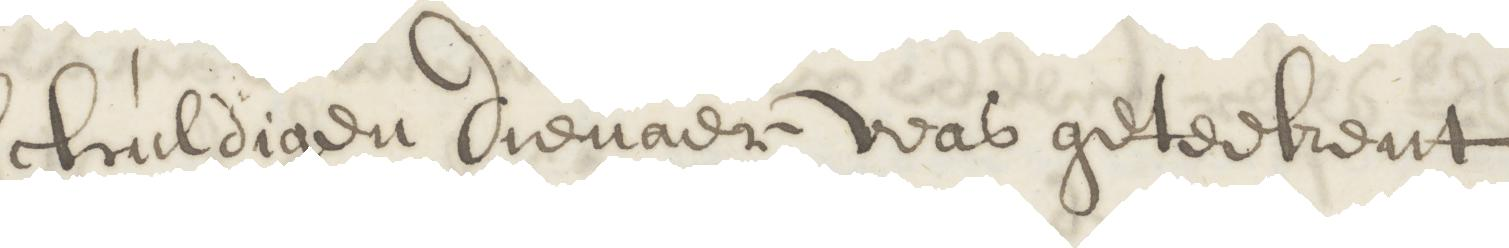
chuldigen dienaer was geteekent
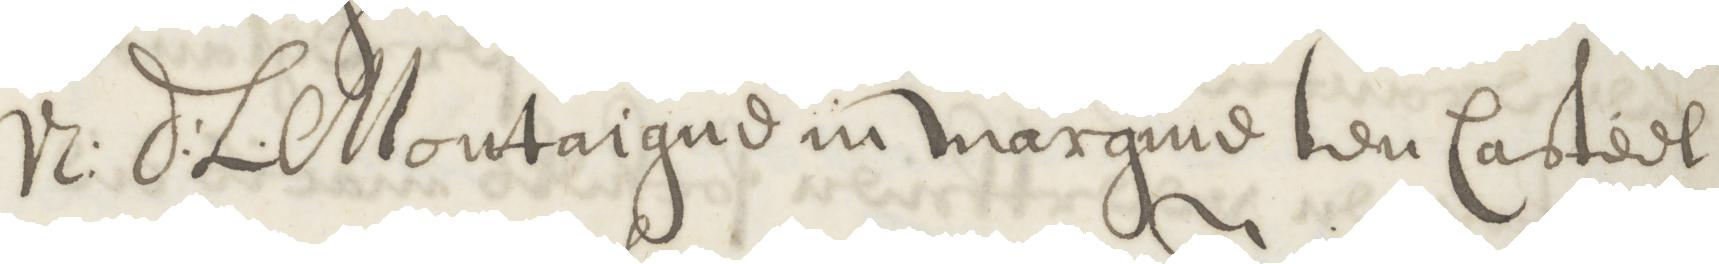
N: d: Lettontaigne in margine ten Casteel
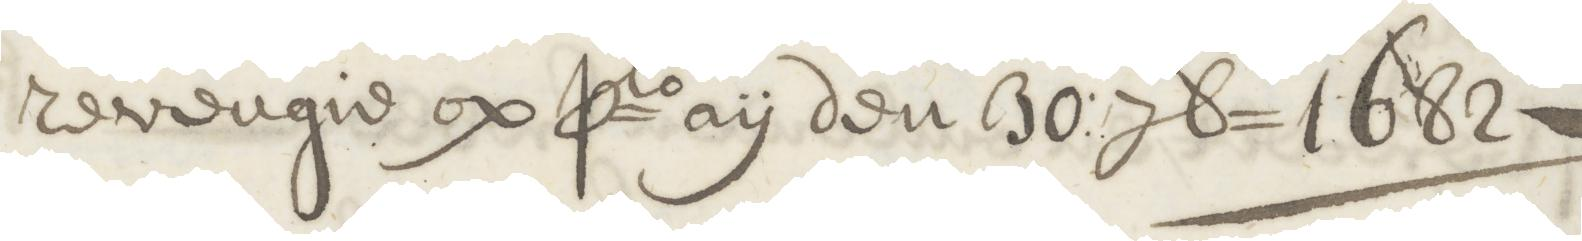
revengie op P=lo aij den 30: 7b= 1682—
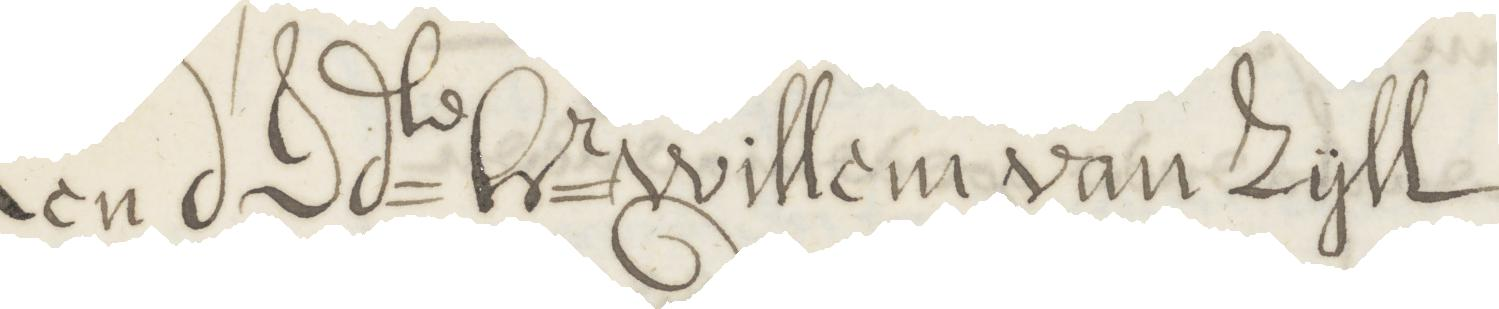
en d'Ed=le H=r willem van zijll
